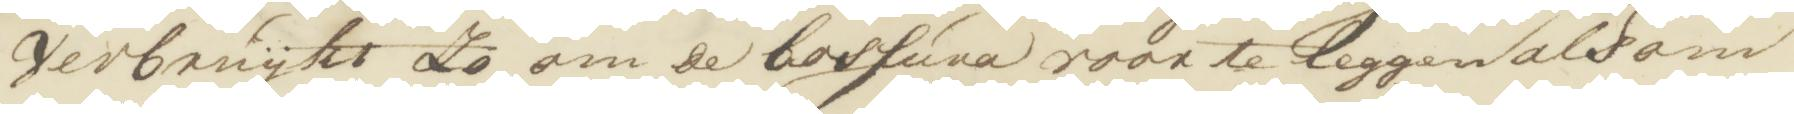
verbruijkt zo om de bossura voor te leggen als om
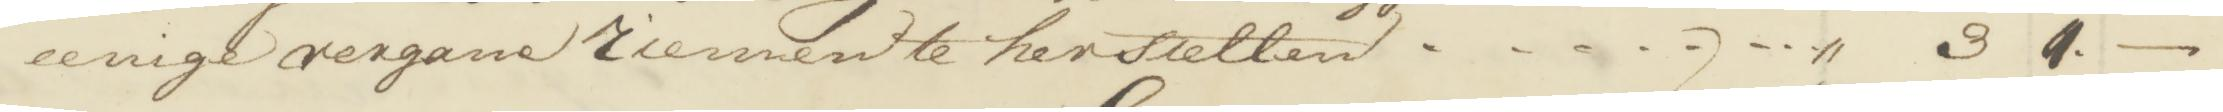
eenige vergane riemen te herstellen - - - - - - - - - „ 3 4. —
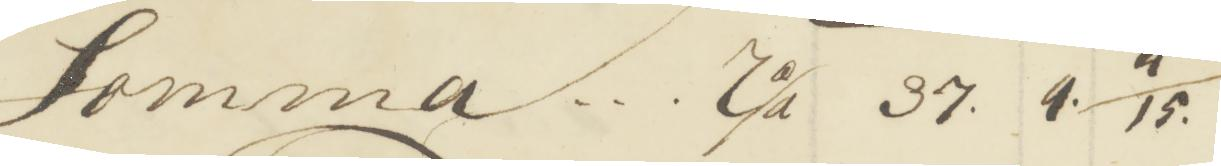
Somma - - - - r:o/a 37. 4. 4/15.
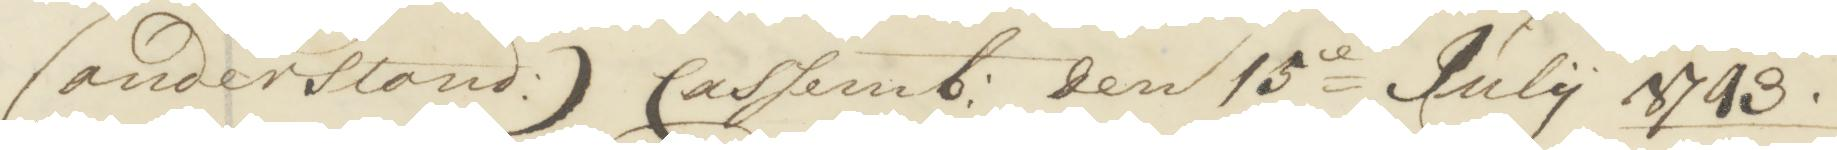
(onderstond:) Cassemb: den 15=e Julij 1743.
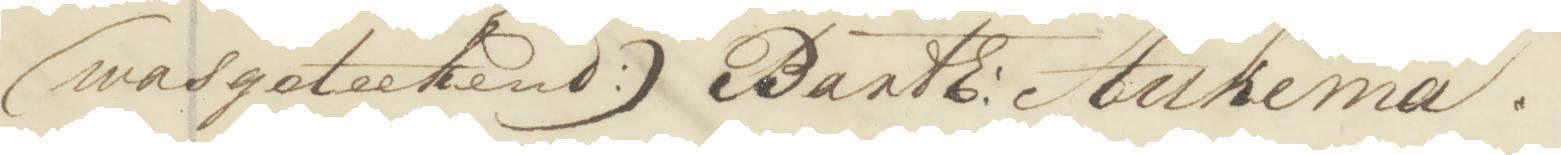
(was geteekend:) Barth: Aukema.
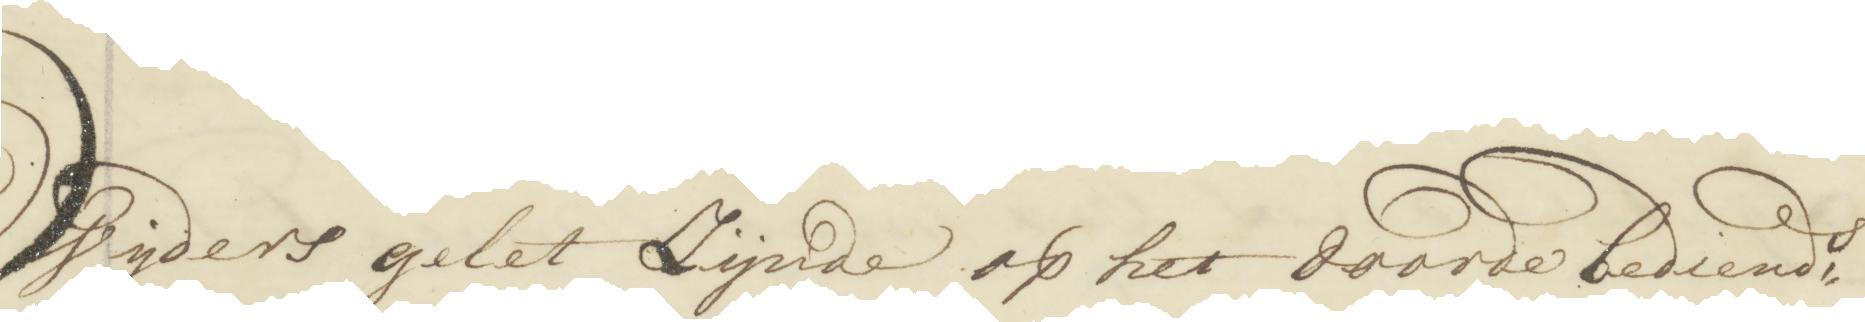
Wijders gelet Zijnde op het door de bediend„s
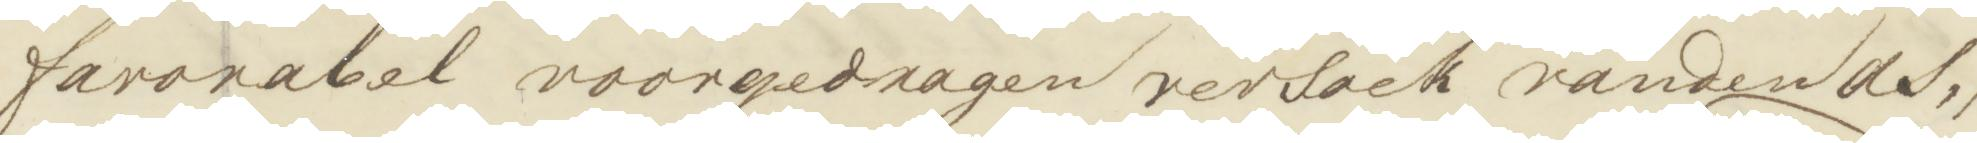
favorabel voorgedragen versoek van den as„
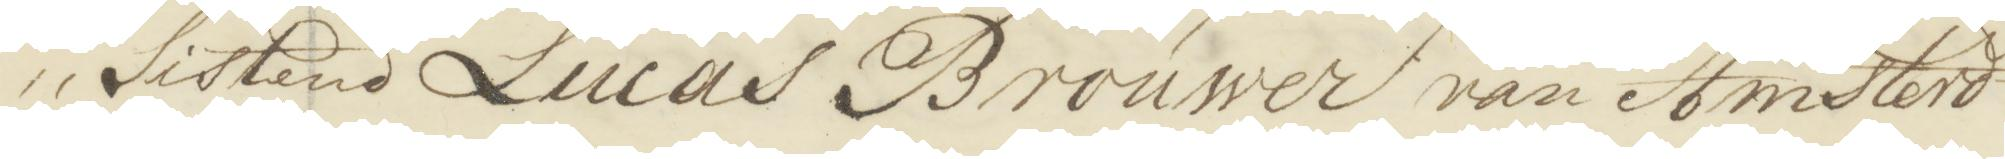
„sistend Lucas Brouwer van Amsterd=m
